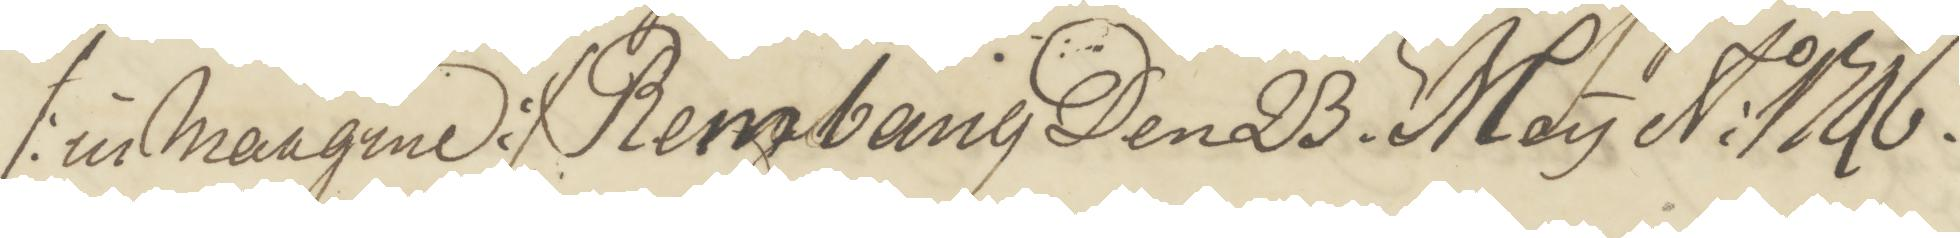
/:in margine:/ Rembang Den 23„' Meij A:o 1746
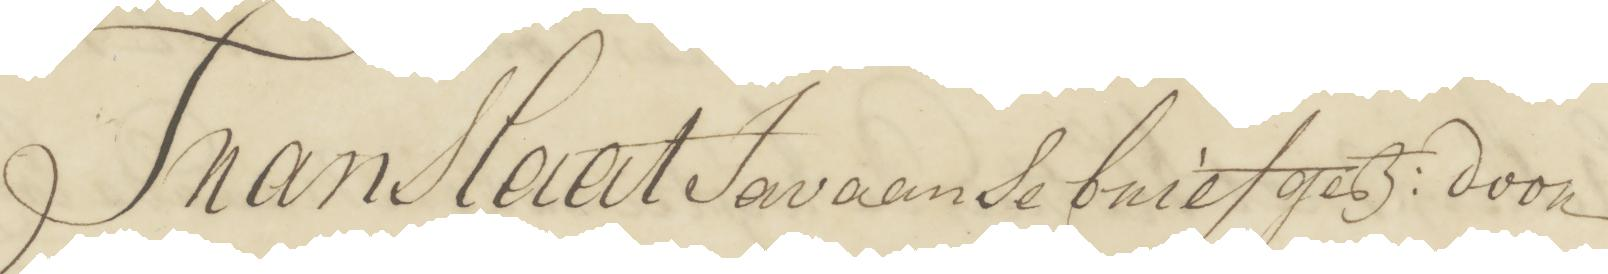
Translaat Javaanse brief gesz: door
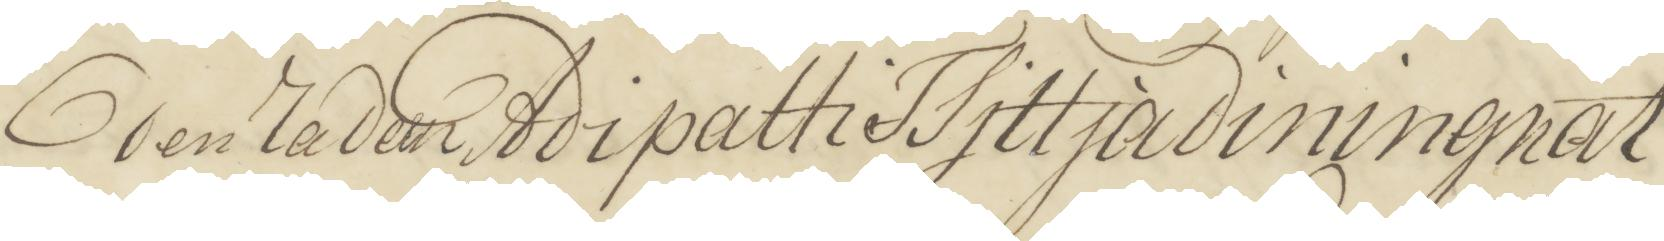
den radeen Adipatti Tsjttjadiningrat
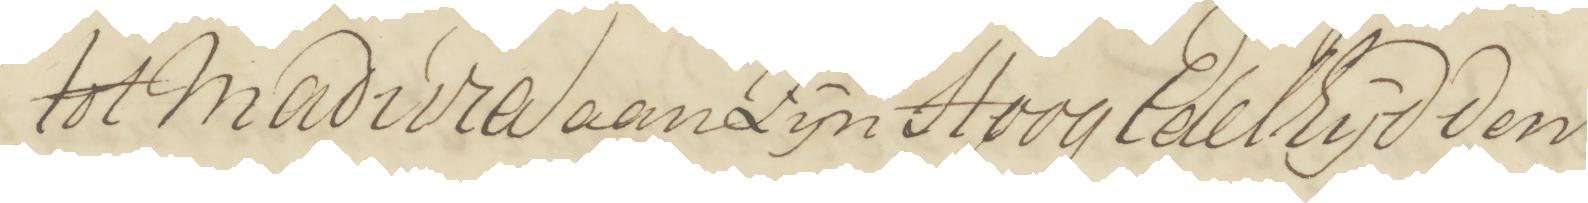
tot madura aan zijn Hoog Edelhijd den
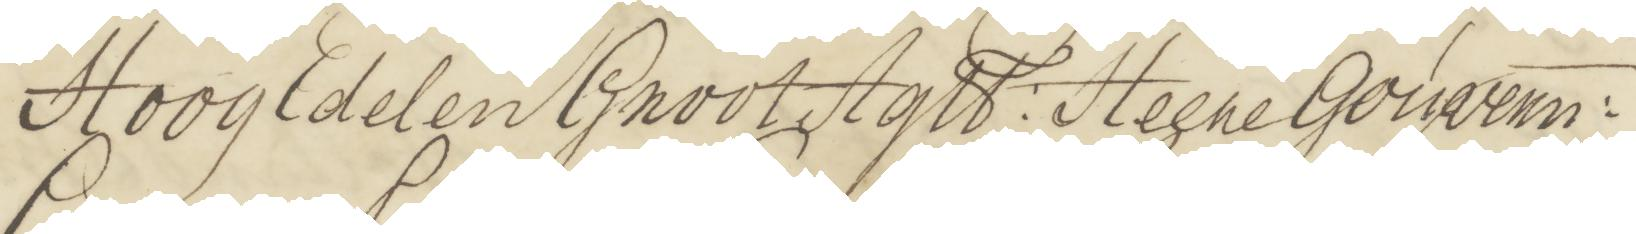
Hoog Edelen Groot Agtb: Heere Gouvern:
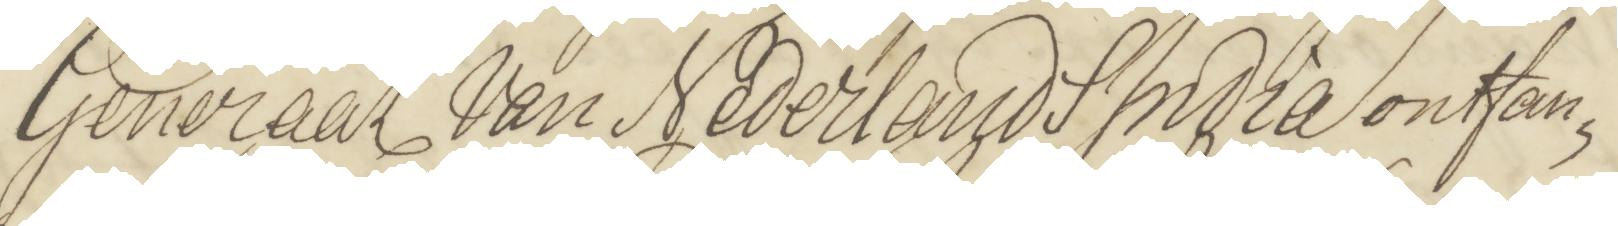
Generaal van Nederlands Jndia ontfan„
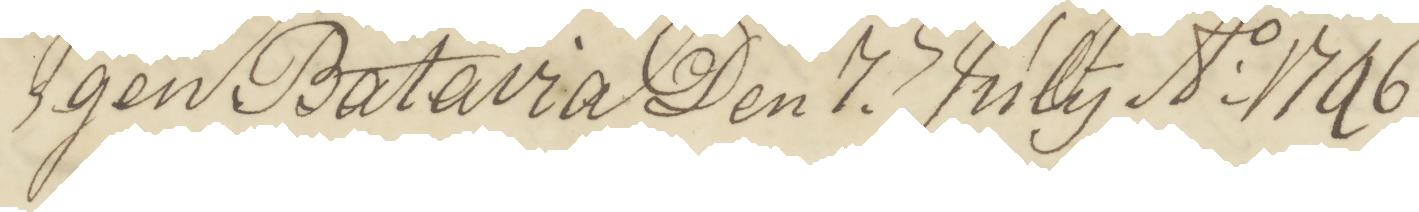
„gen Batavia Den 7„' Julij A:o 1746
